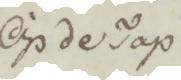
Op de Tap
